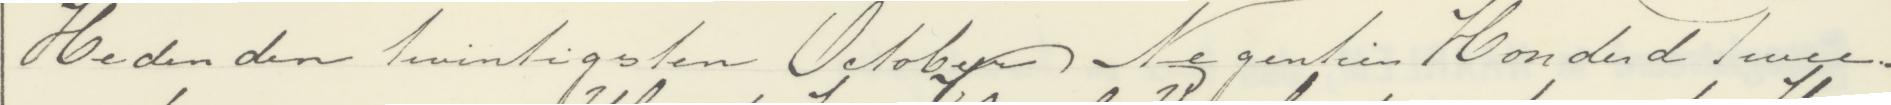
Heden den twintigsten October Negentien Honderd Twee
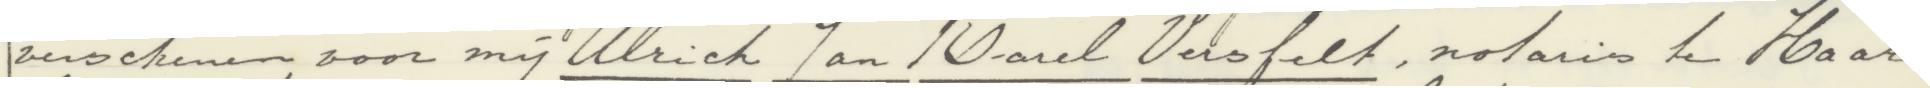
verschenen voor mij Ulrich Jan Karel Versfelt, notaris te Haar
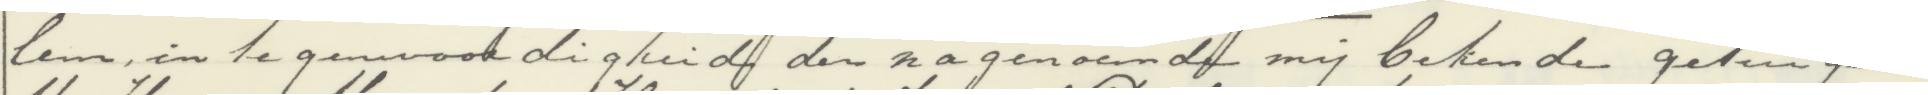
lem, in tegenwoordigheid der nagenoemde mij bekende getuigen:
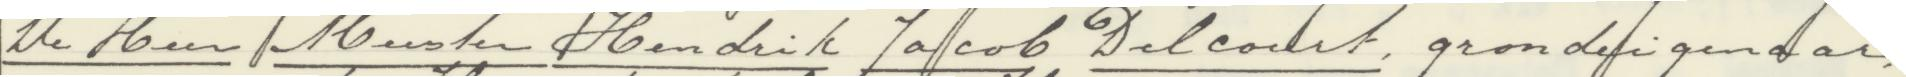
De Heer Meester Hendrik Jacob Delcourt, grondeigenaar
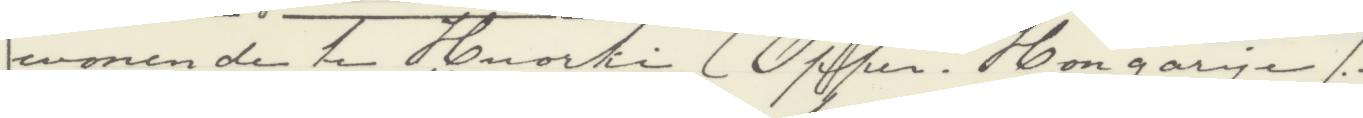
wonende te Huorki ( Opper - Hongarije /.
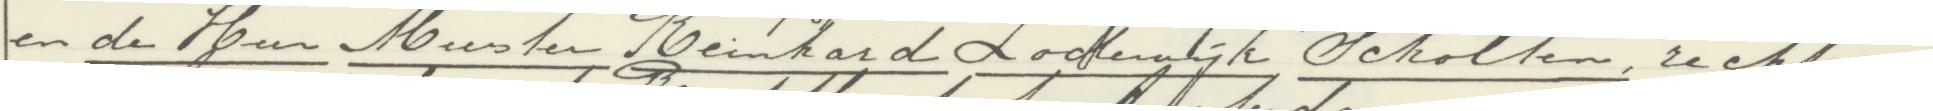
en de Heer Meester Reinhard Lodewijk Scholten, rechter in
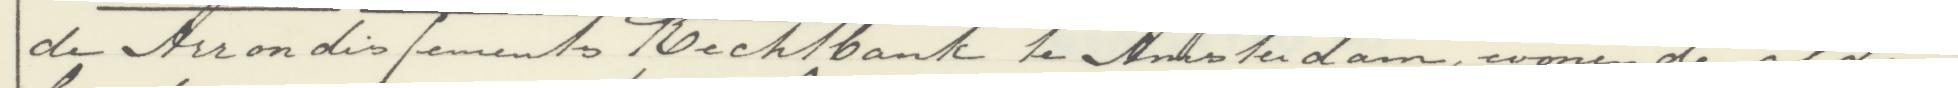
de Arrondissements Rechtbank te Amsterdam, wonende aldaar,
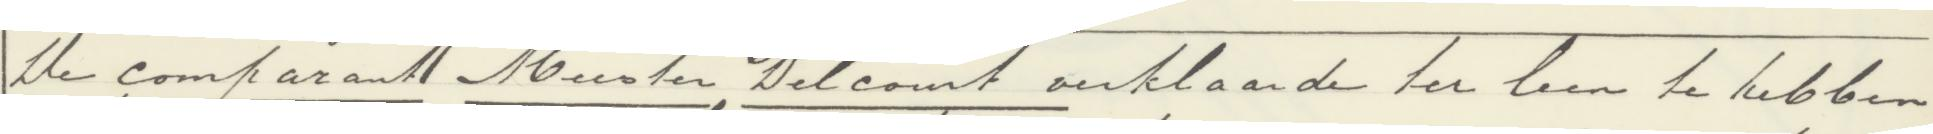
De comparant Meester Delcourt verklaarde ter leen te hebben
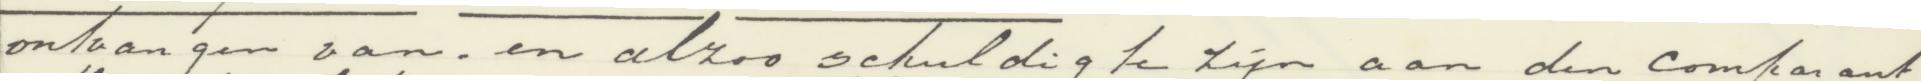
ontvangen van, en alzoo schuldig te zijn aan den comparant
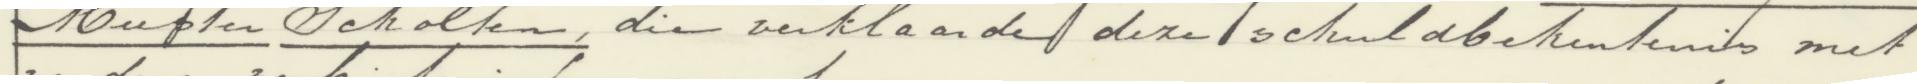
Meester Scholten, die verklaarde deze schuldbekentenis met
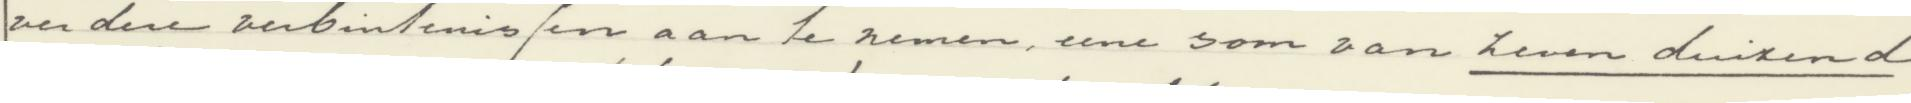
verdere verbintenissen aan te nemen, eene som van zeven duizend
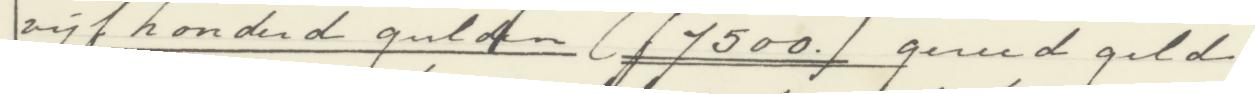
vijf honderd gulden (ƒ7500.) gereed geld
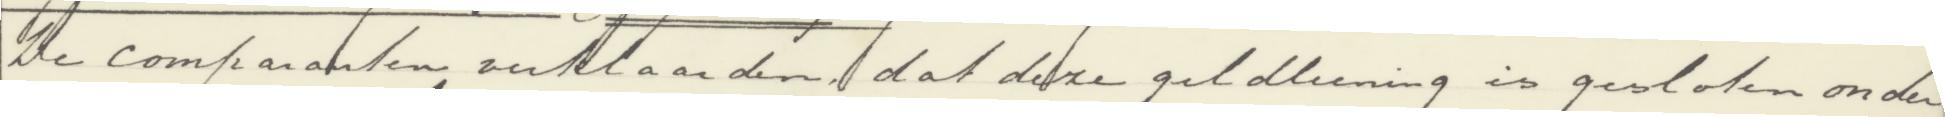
De comparanten verklaarden, dat deze geldleening is gesloten onder
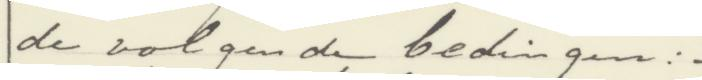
de volgende bedingen:
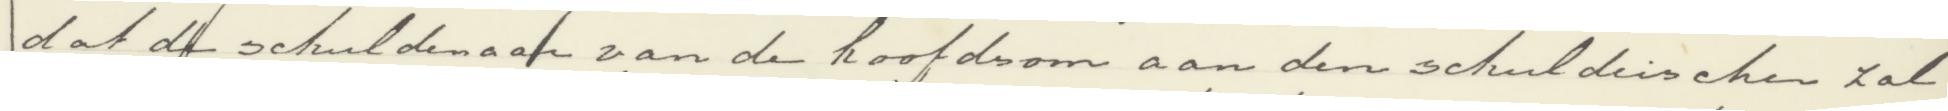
dat de schuldenaar van de hoofdsom aan den schuldeischer zal
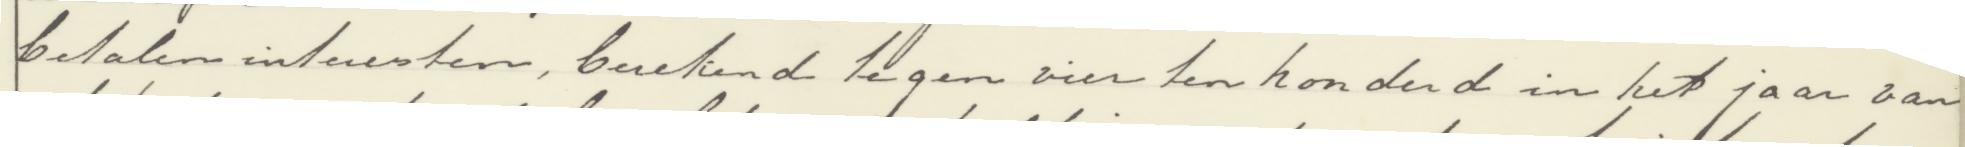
betalen interesten, berekend tegen vier ten honderd in het jaar van
